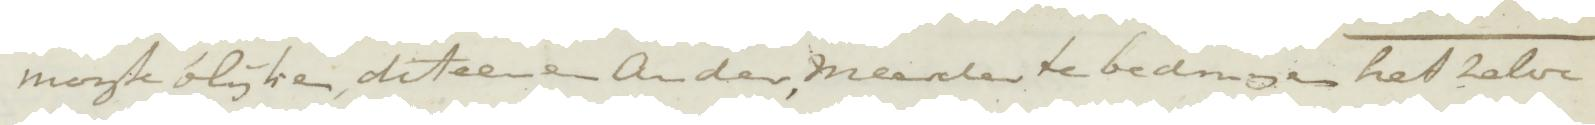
mogte blijken, dit een en ander, meerder te bedingen het zelve
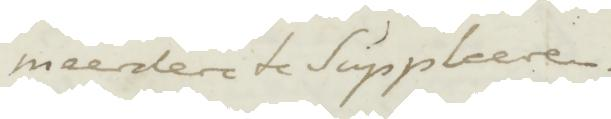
meerder te Suppleeren.
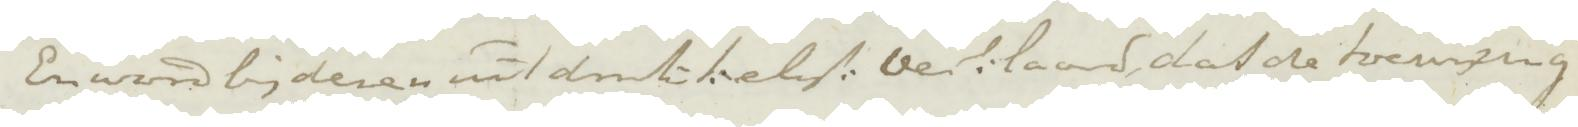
En word bij desen uitdrukkelijk verklaard, dat de toewijzing
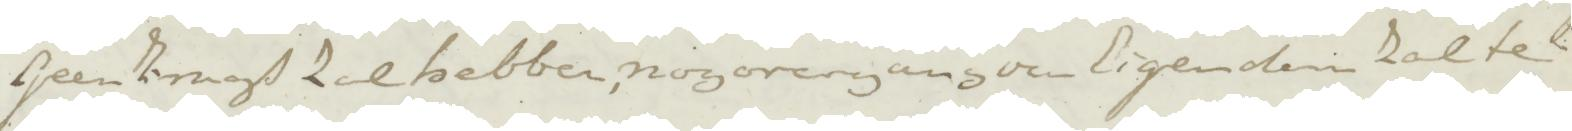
Geen kragt zal hebben, nog overgang van Eigendom zal te
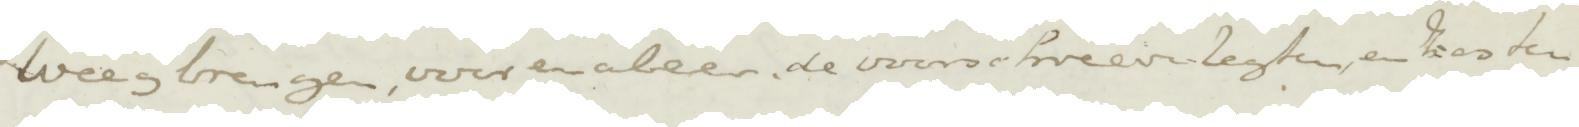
weeg bregen, voor en aleer de voorschreeve regten, en kosten
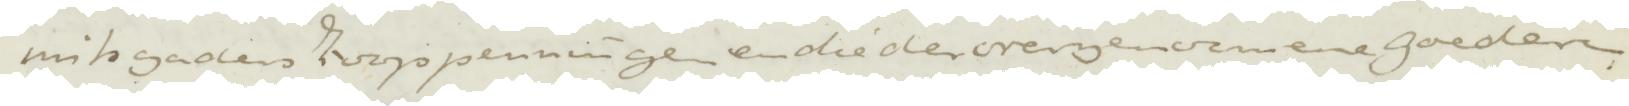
mitsgaders kooppenningen en die der overgenomen goederen
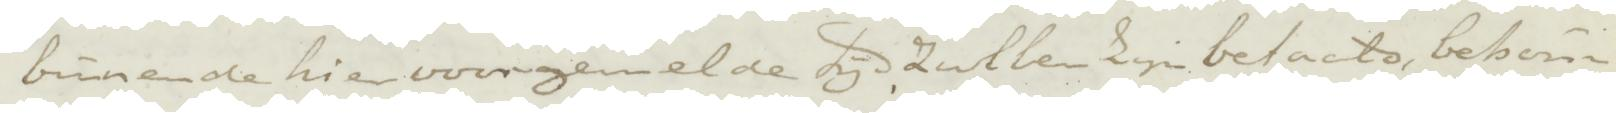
binnen de hier voorgemelde tijd zullen zijn betaald, behou-
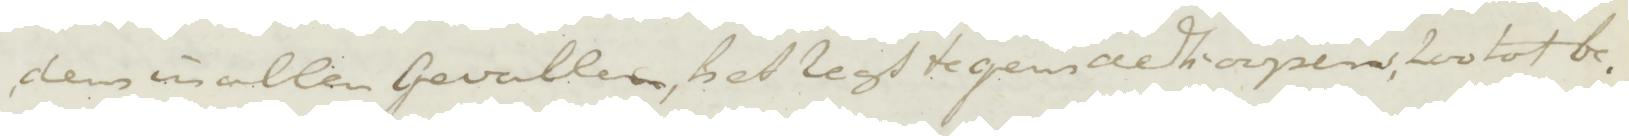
,dens in allen gevallen, het regt tegens de koopers, Zoo tot be,
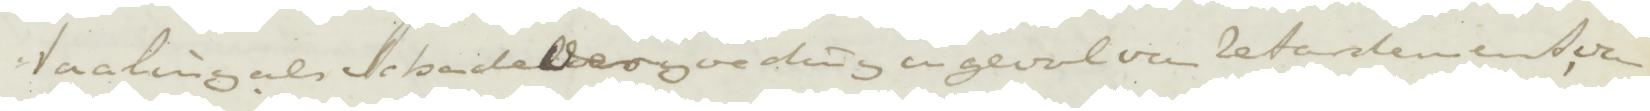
-taaling als Schadevergoeding in geval van retardement van
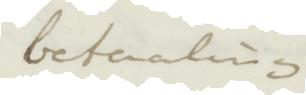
betaaling.
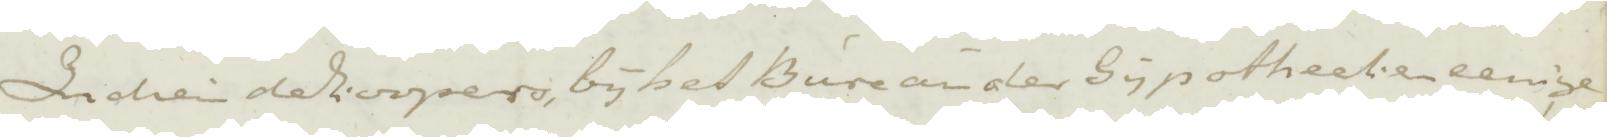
Indien de koopers, bij het Bureau der hijpotheeken eenige
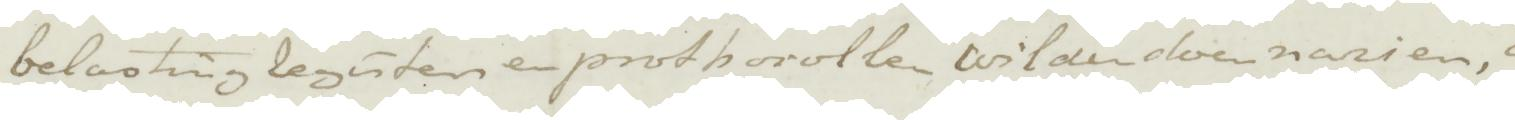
belasting registers en prothocollen wilden doen nazien, of
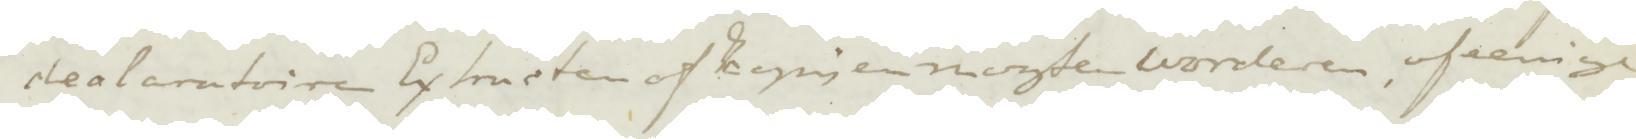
declaratoire Extracten of kopijen mogte vorderen of eenige
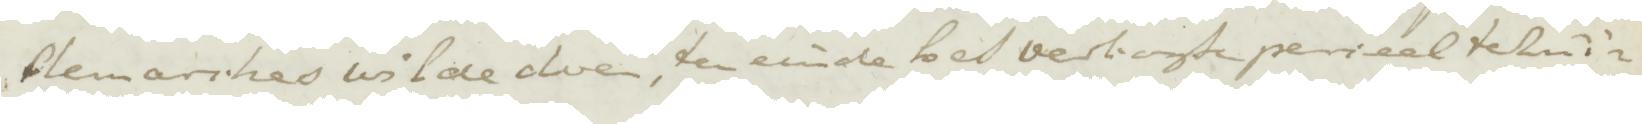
demarches wilde doen, ten einde het verkogte perceel te zui=
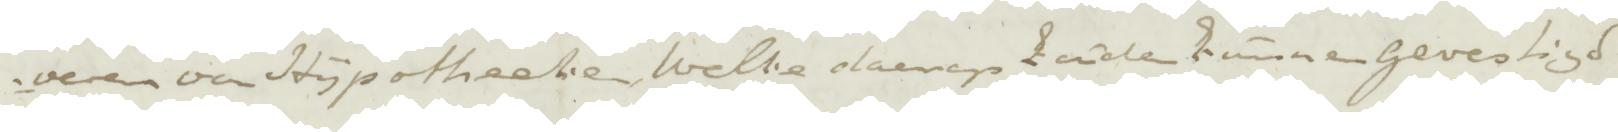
=veren van Hypotheeke, welke daarop Zouden kunnen Gevestigd
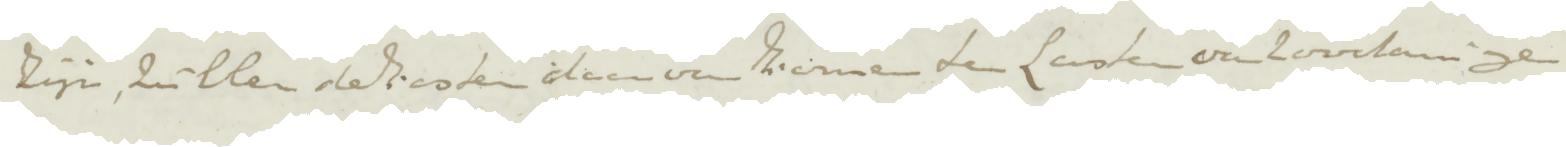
zijn, zullen de kosten daarvan komen ten Lasten van Zoodanige
